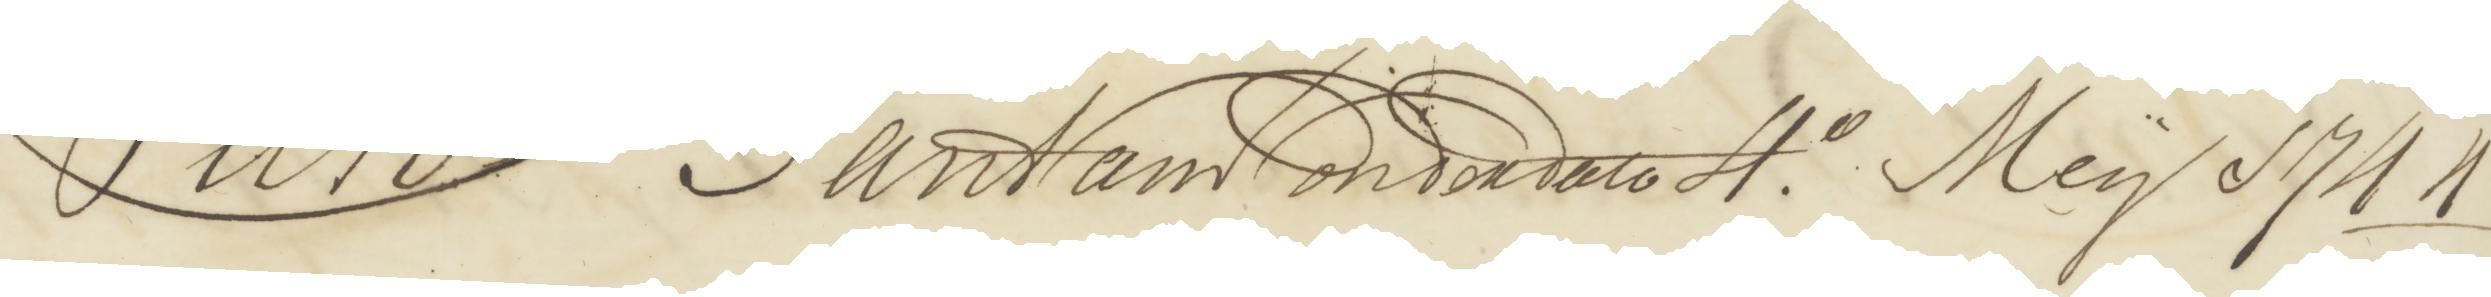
Van Bantam onderdato 11.e Meij 1744
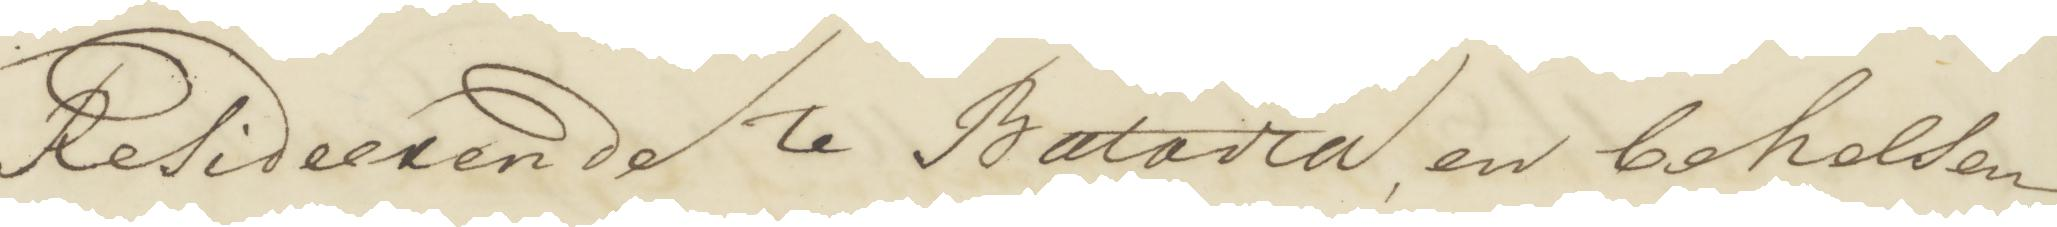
Resideerende te Batavia, en behelsen
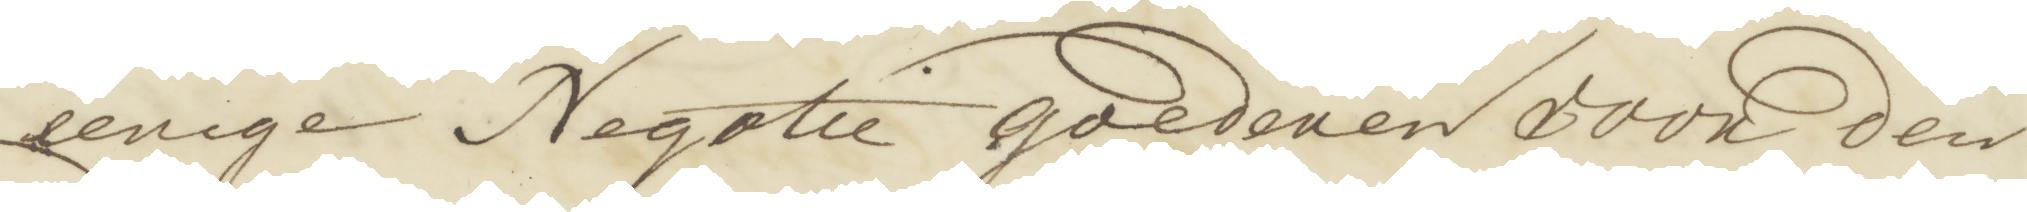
eenige Negotie goederen voor den
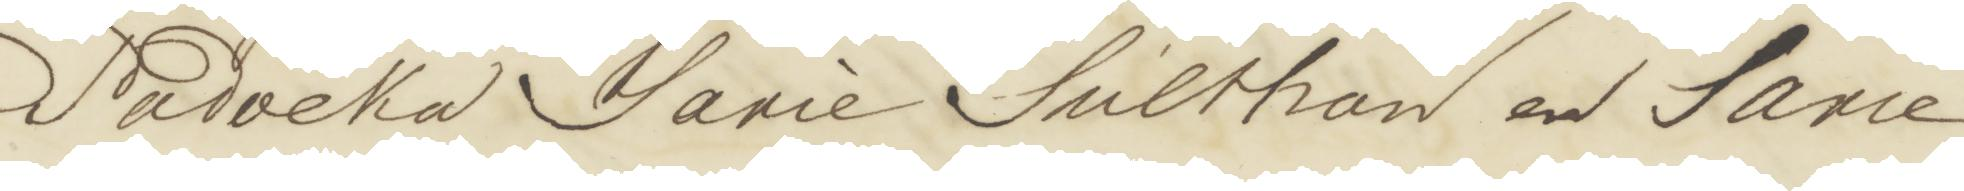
Padoeka sarie sulthan en sarie
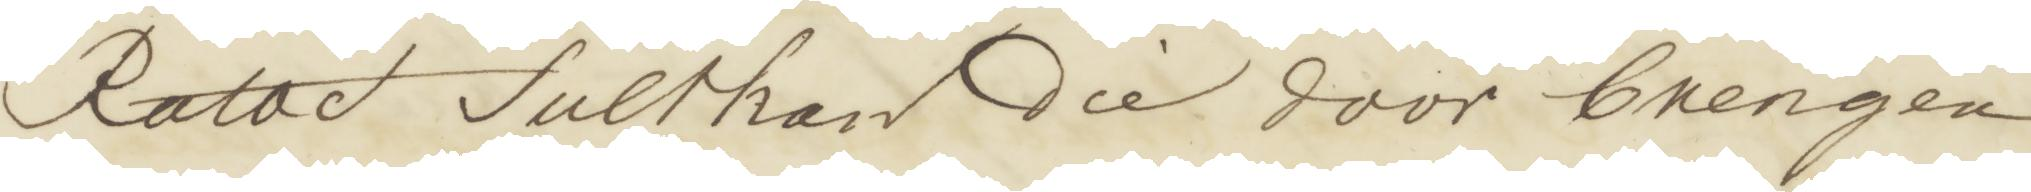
Ratas sulthan die door brengen
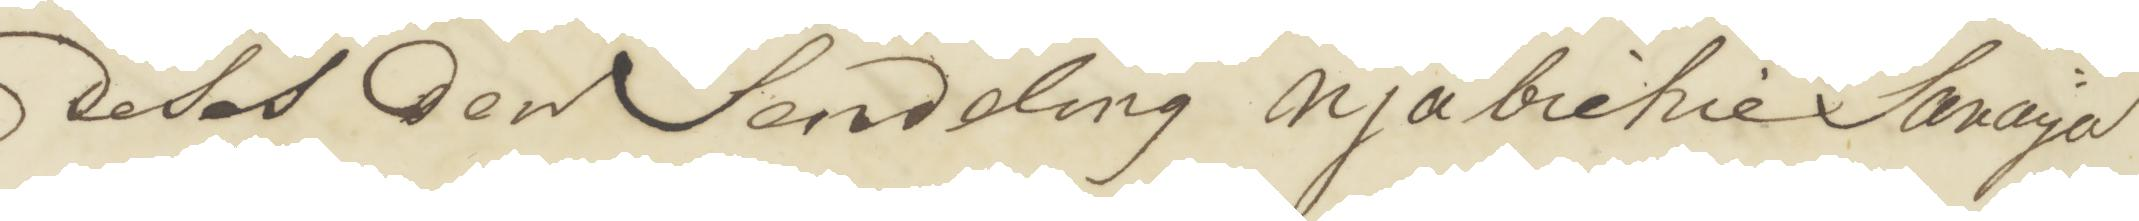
deses den sendeling njabiehie saraija
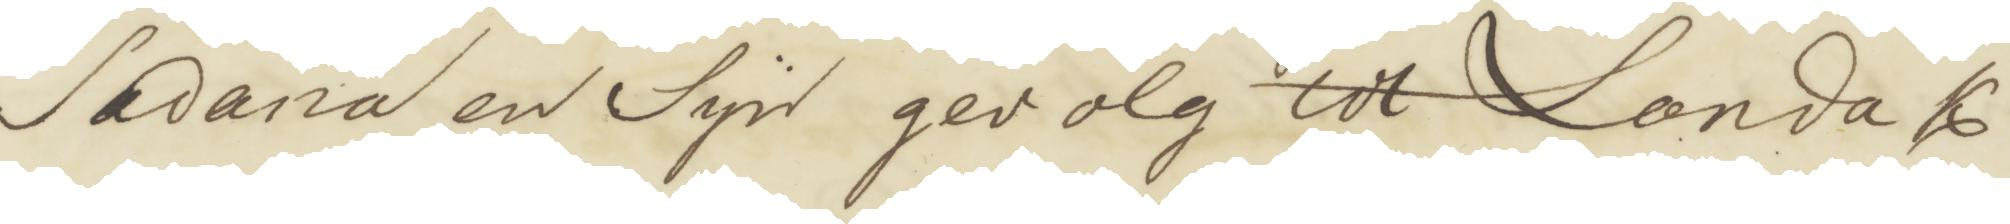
sadana en sijn gevolg tot Londak
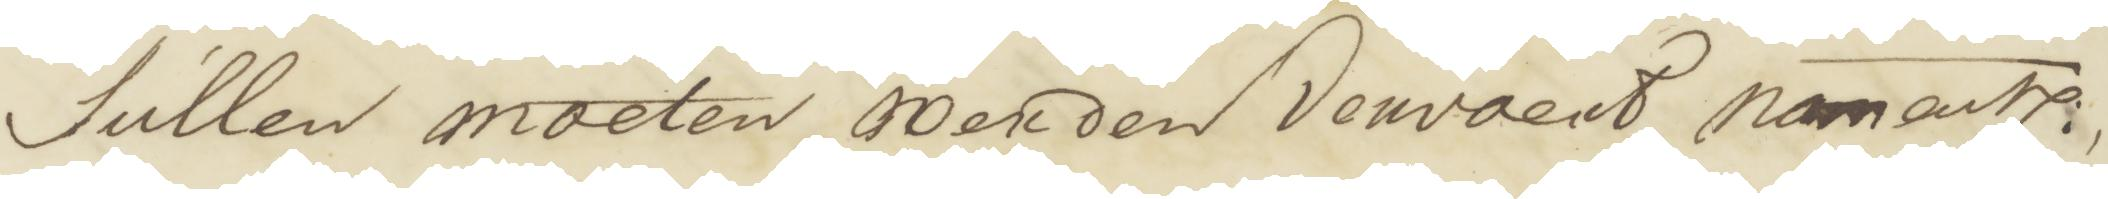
sullen moeten werden vervoert, namentlijk:,
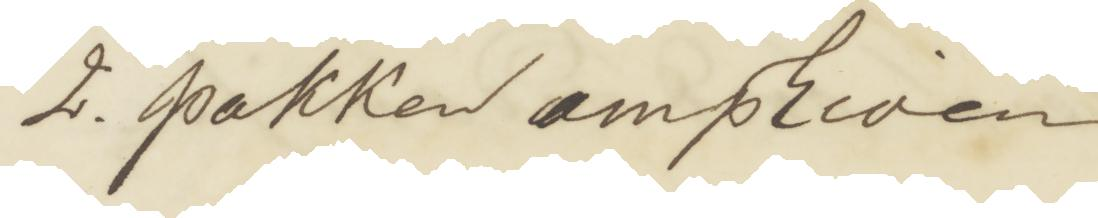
2. _„o pakken amphioen
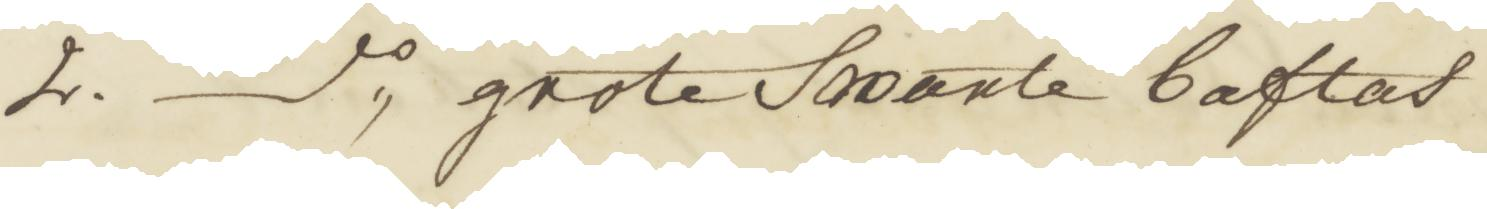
2. _„o grote swarte baftas
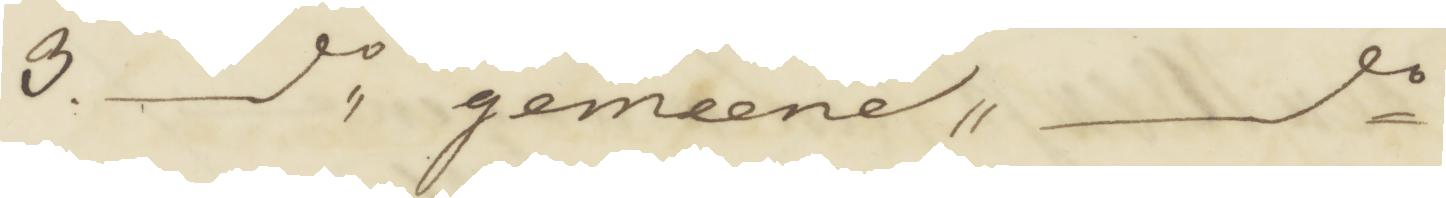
3. _„o gemeene „ _=o
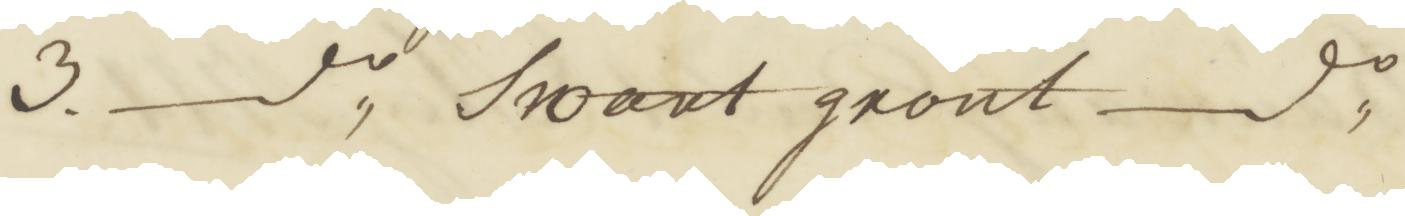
3. _„o swart gront _„o
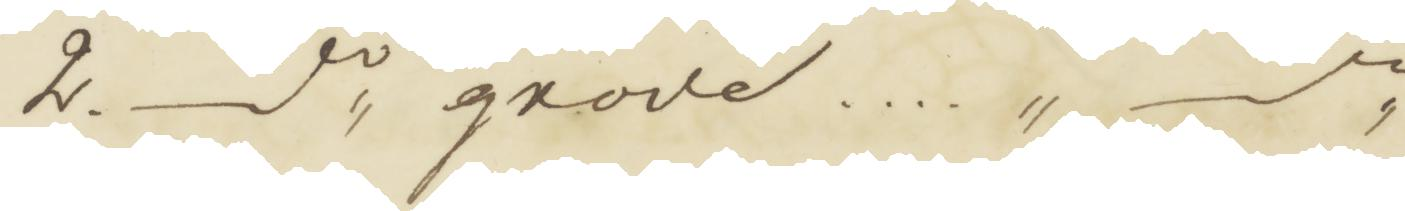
2. _„o grove .... „ _„o
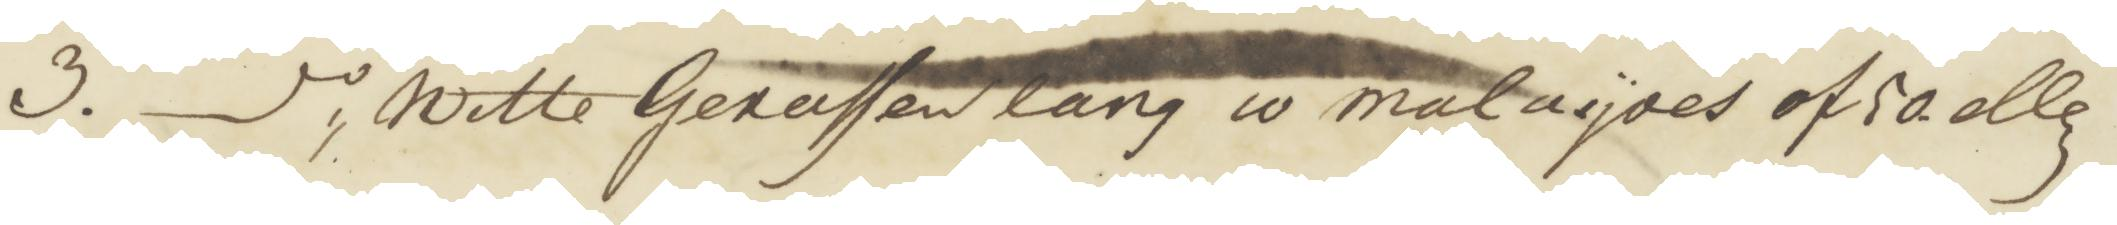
3. _„o witte Gerassen lang 10 malaijoes of 50. ellen
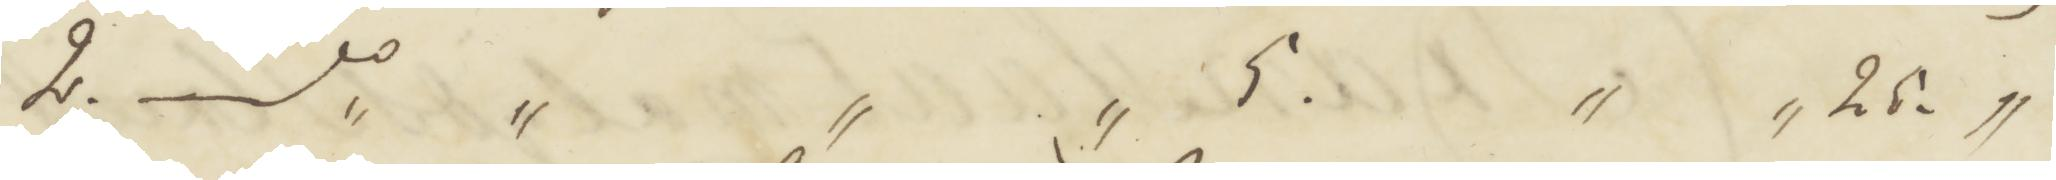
2. _„o „ „ „ 5. „ „ 25. „
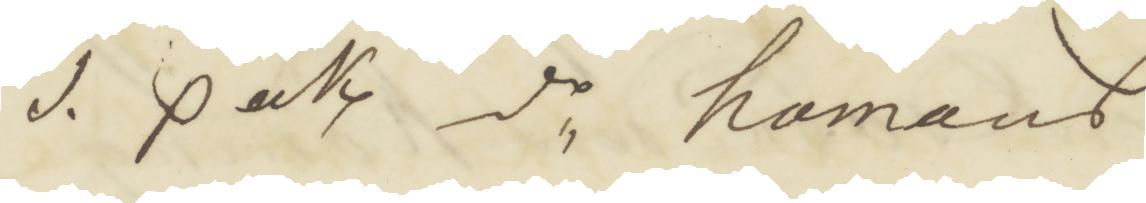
1. pak d„o hamans
